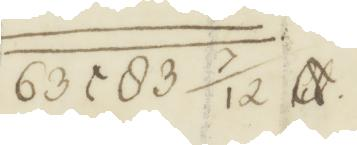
63583 7/12 lb
